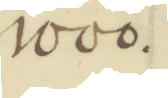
1000.
